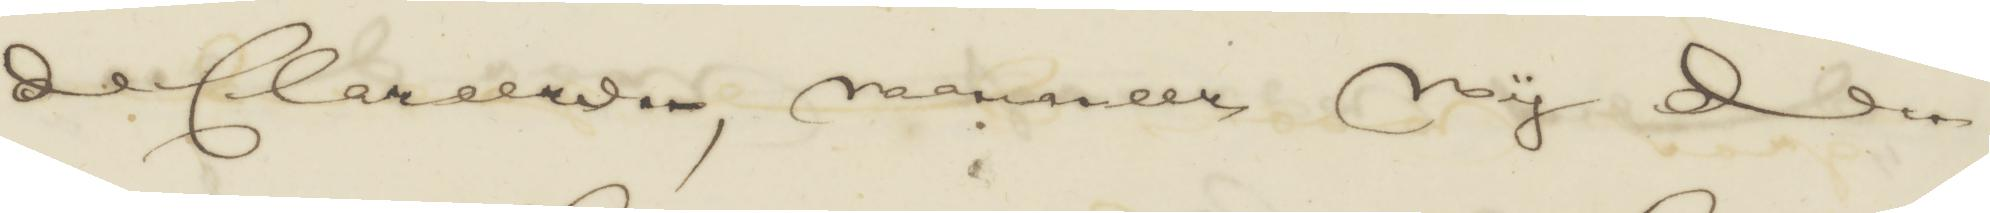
de Clareeren, wanneer wij den
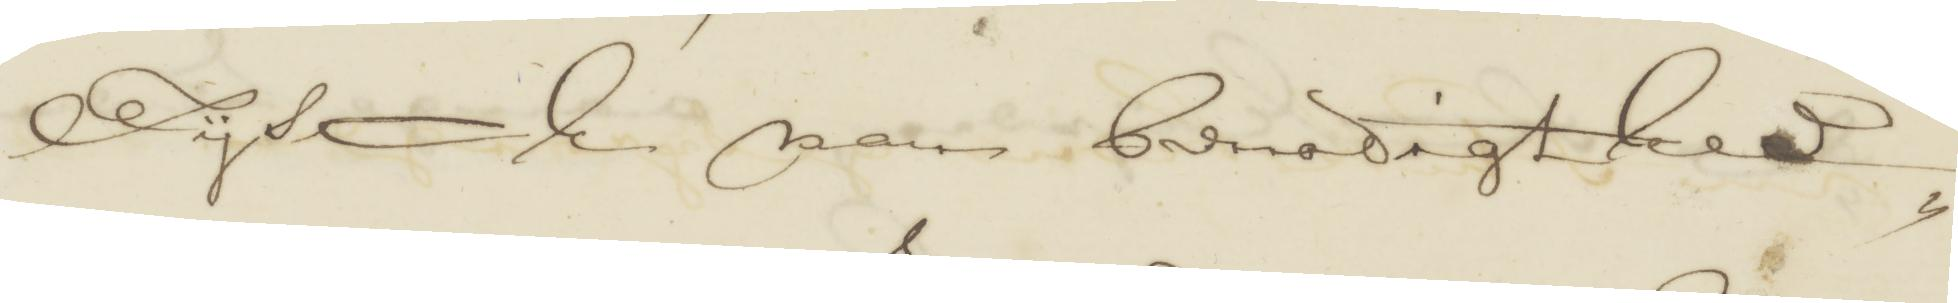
Eijsch van benodigthee„
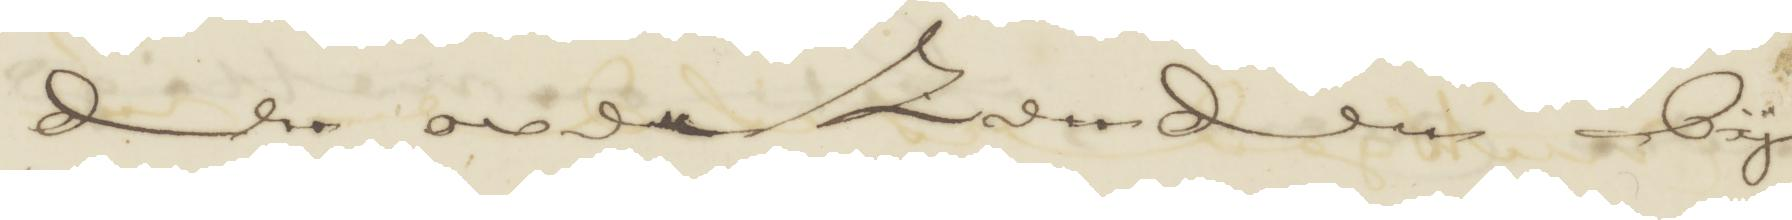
den overzenden, bij
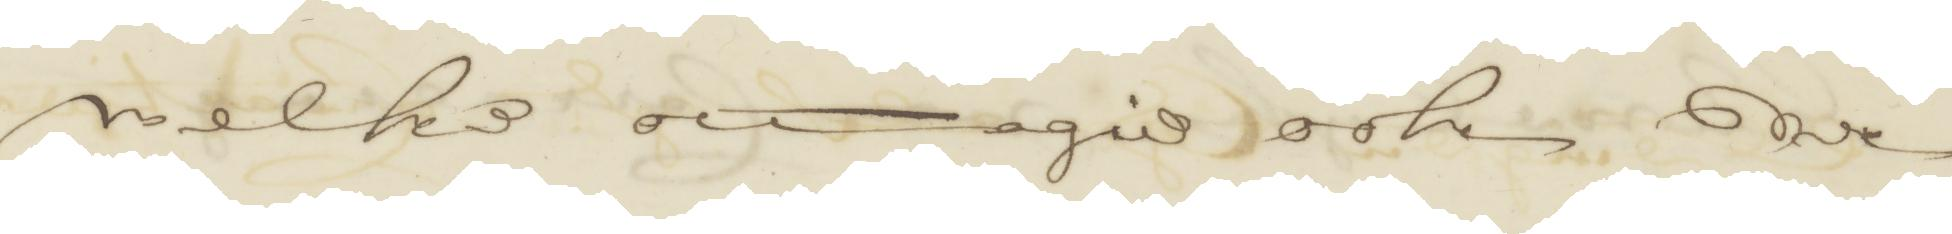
welke occagie ook der
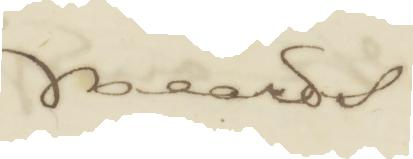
waards
